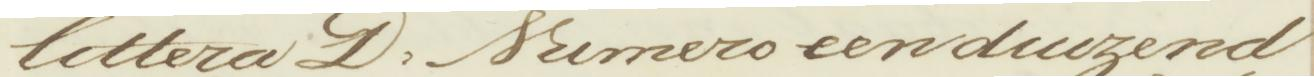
littera D: Numero een duizend
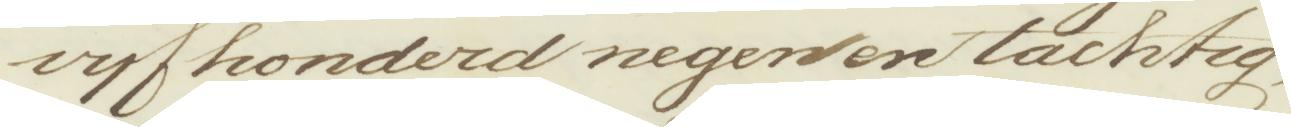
vyf honderd negen en tachtig,
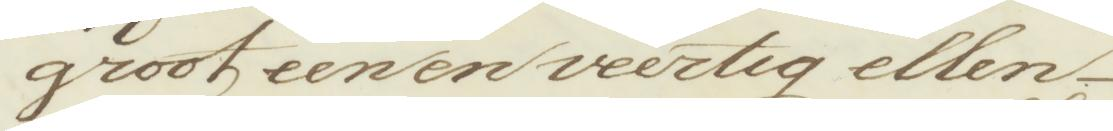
groot een en veertig ellen. —
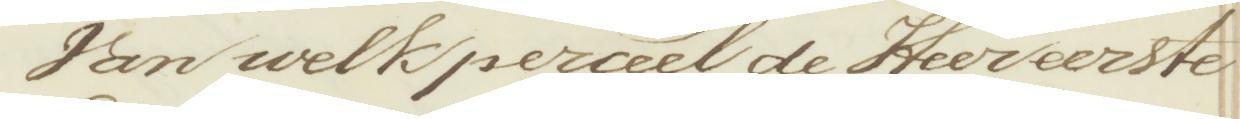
Van welk perceel de Heer eerste
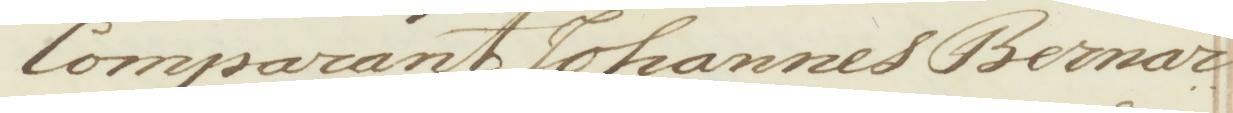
Comparant Johannes Bernar„
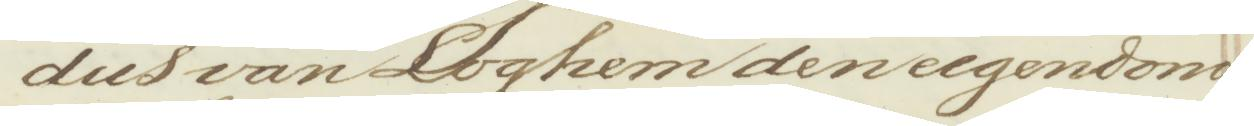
dus van Loghem den eigendom
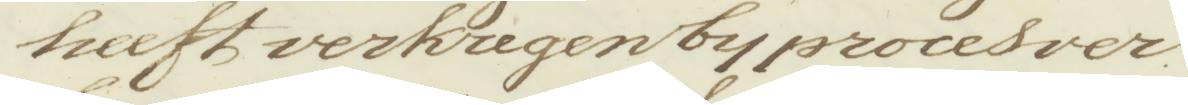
heeft verkregen by procesver,
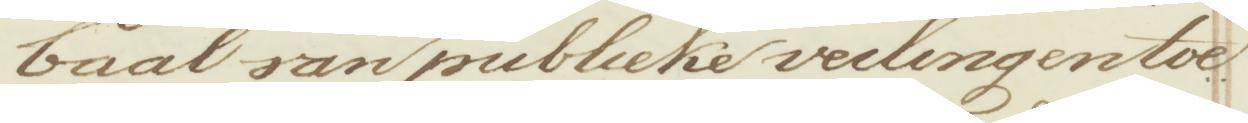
baal van publieke veiling en toe„
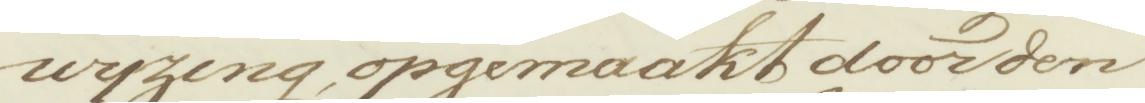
wyzing, opgemaakt door den
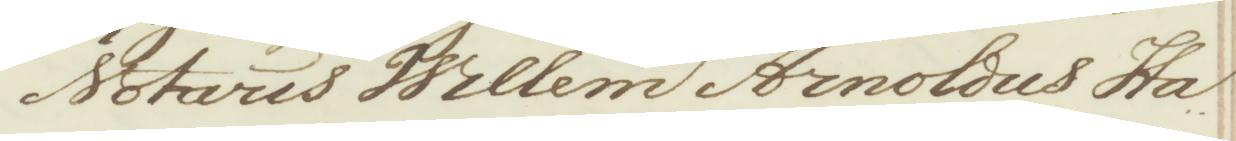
Notaris Willem Arnoldus Ha„
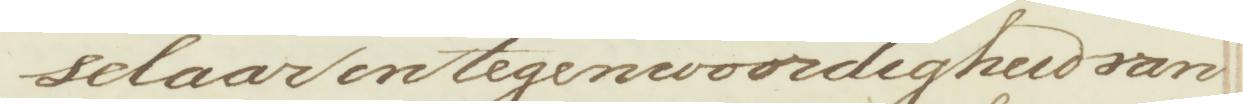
selaar in tegenwoordigheid van
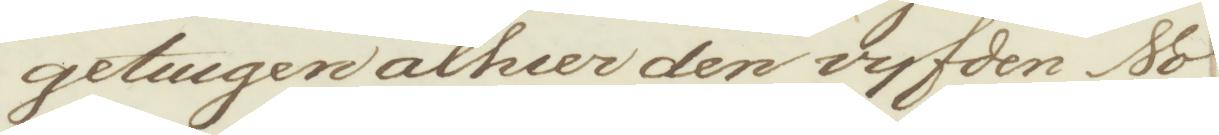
getuigen alhier den vyfden No
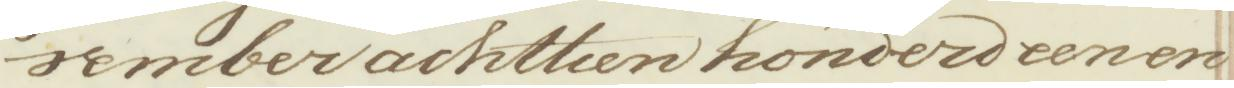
vember achttien honderd eenen
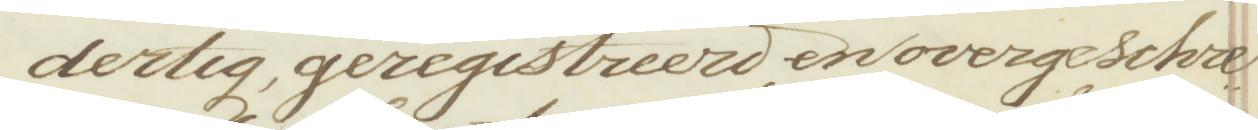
dertig, geregistreerd, en overgeschre„
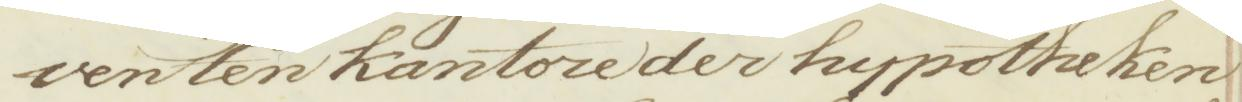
ven ten kantore der hypotheken
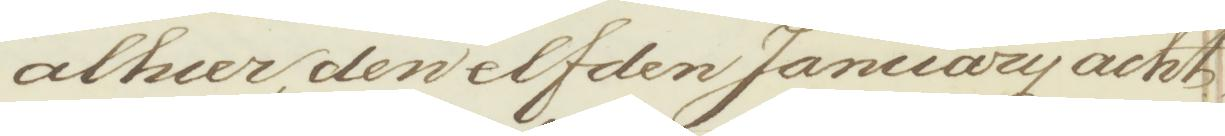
alhier, den elfden January acht
